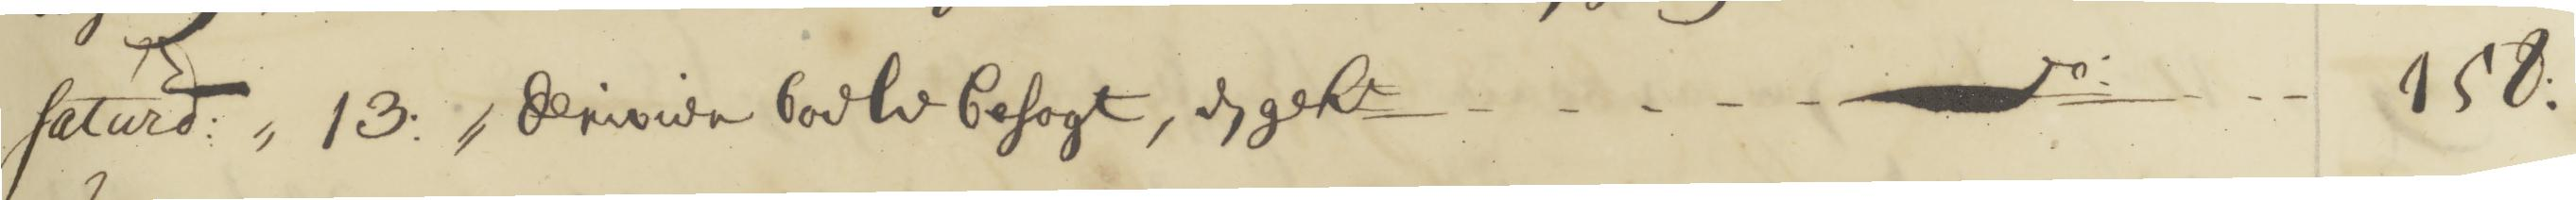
saturd: „ 13: „ de rivier boele besogt, en gek=t - - - - - —:o 158:
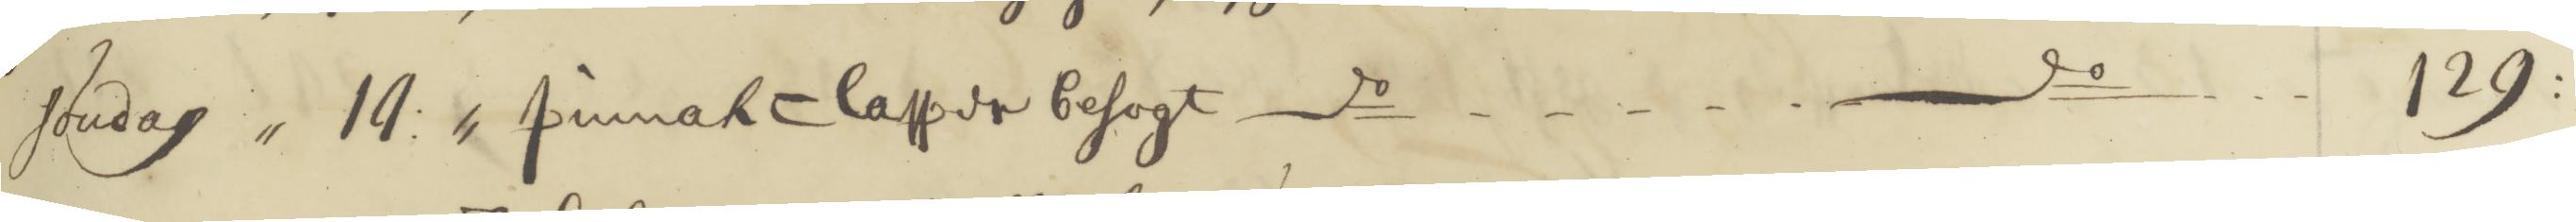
sondag „ 14: „ pinnak clapper besogt —:o —:o - - - 129:
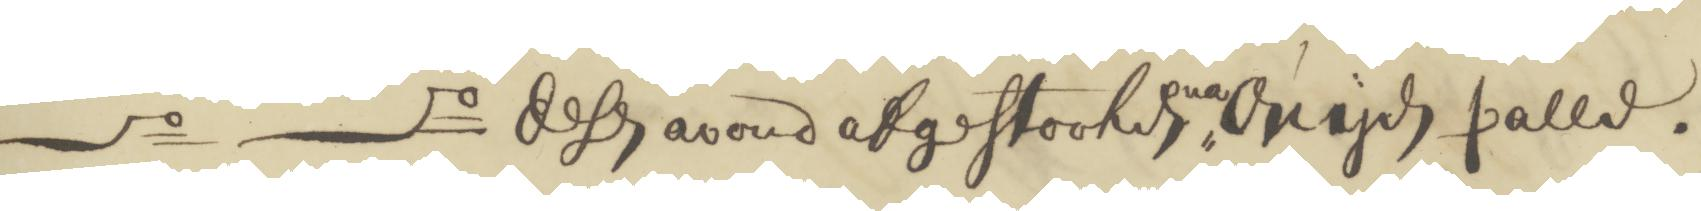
—:o —:o desen avond afgestooken:na „ Orijen palle.
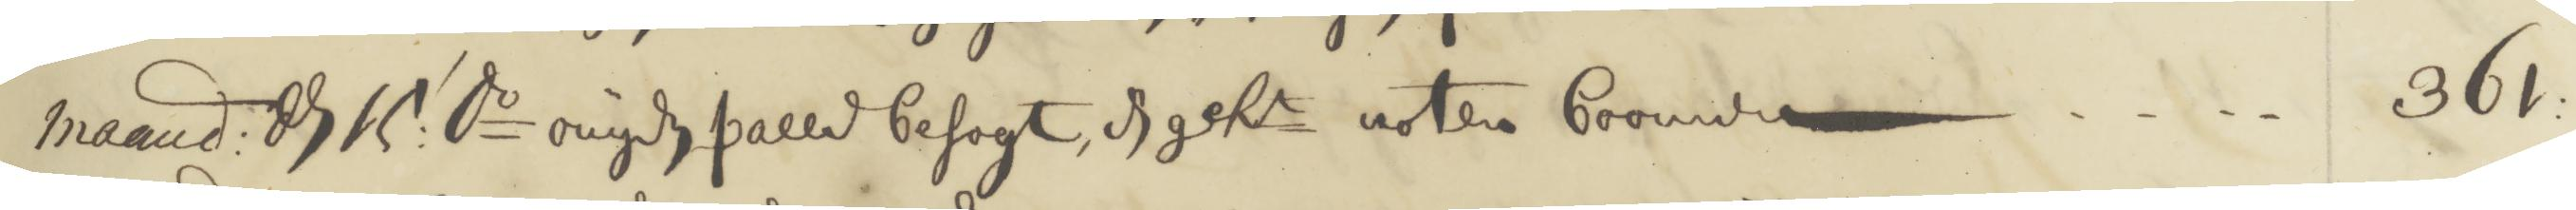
maand: den 15:' d=o orijen palle besogt, en gek=t noten boomen - - - - 361:
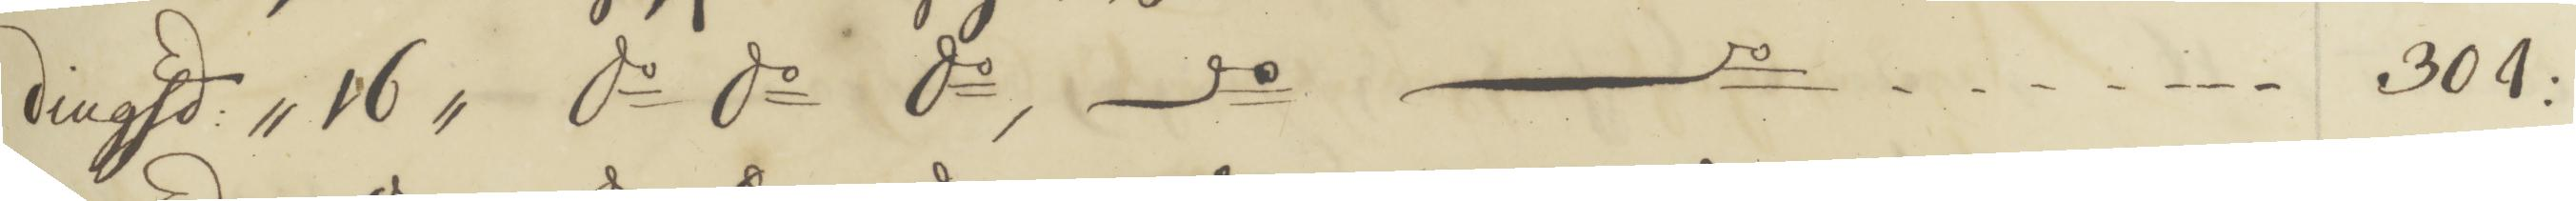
dingsd: „ 16 „ d=o d=o d=o, —:o —:o 304:
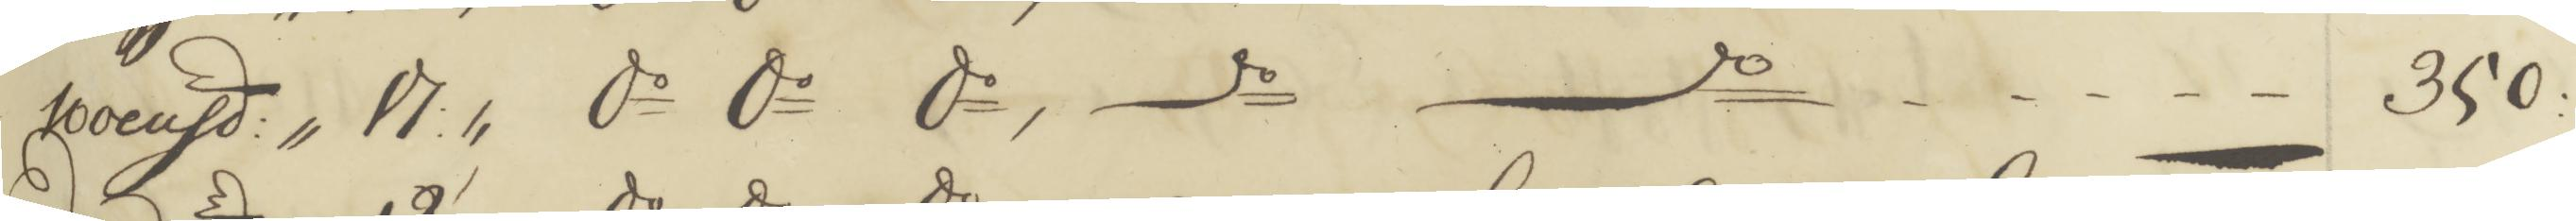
woensd: „ 17: „ d=o d=o d=o, —:o —:o 350:
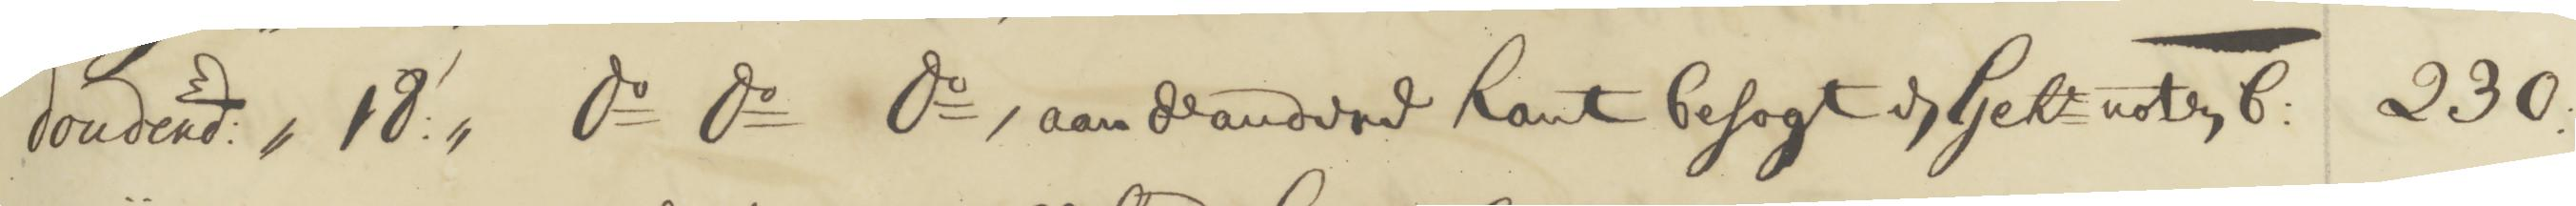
donderd: „ 18:' „ d=o d=o d=o, aan de andere kant besogt en Gekt noten b: 230:
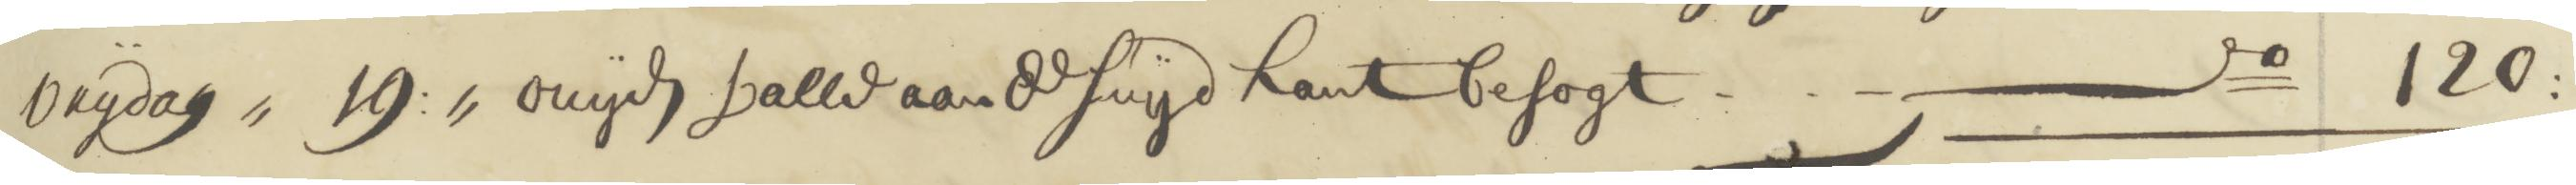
vrijdag „ 19: „ orijen palle aan de suijd kant besogt - -—:o 120:
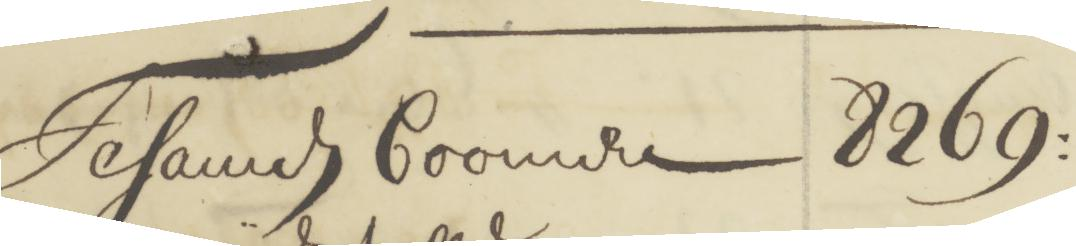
Tesamen boomen 8269:
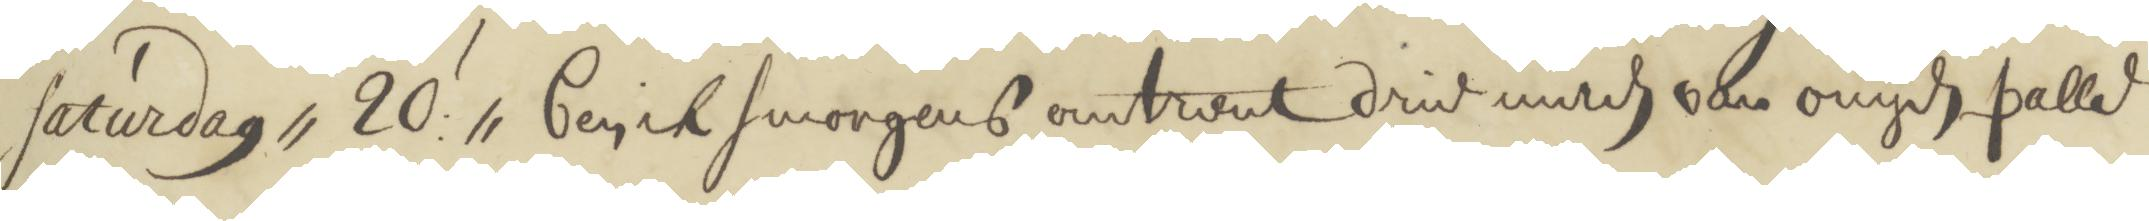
saturdag„ 20:' „ ben ik smorgens omtrent drie uuren van orijen palle
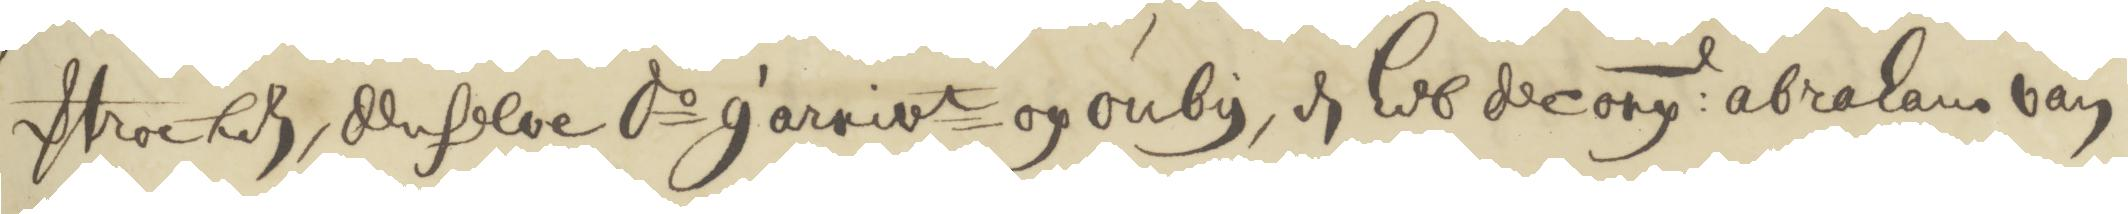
vertrocken, denselve d=o g’arriv=t op oubij, en heb de corp:l abraham van
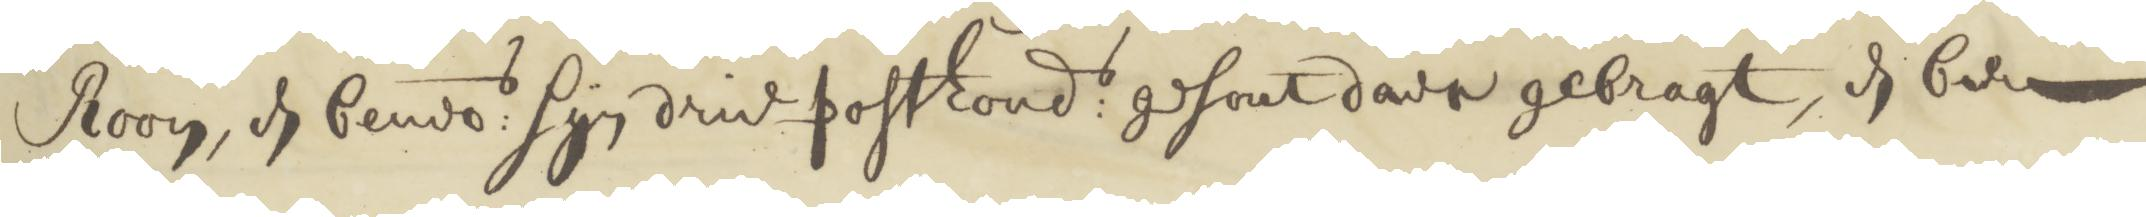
Roon, en benev:s sijn drie posthoud:s gesont daer gebragt, en ben
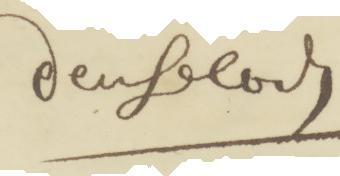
denselven
